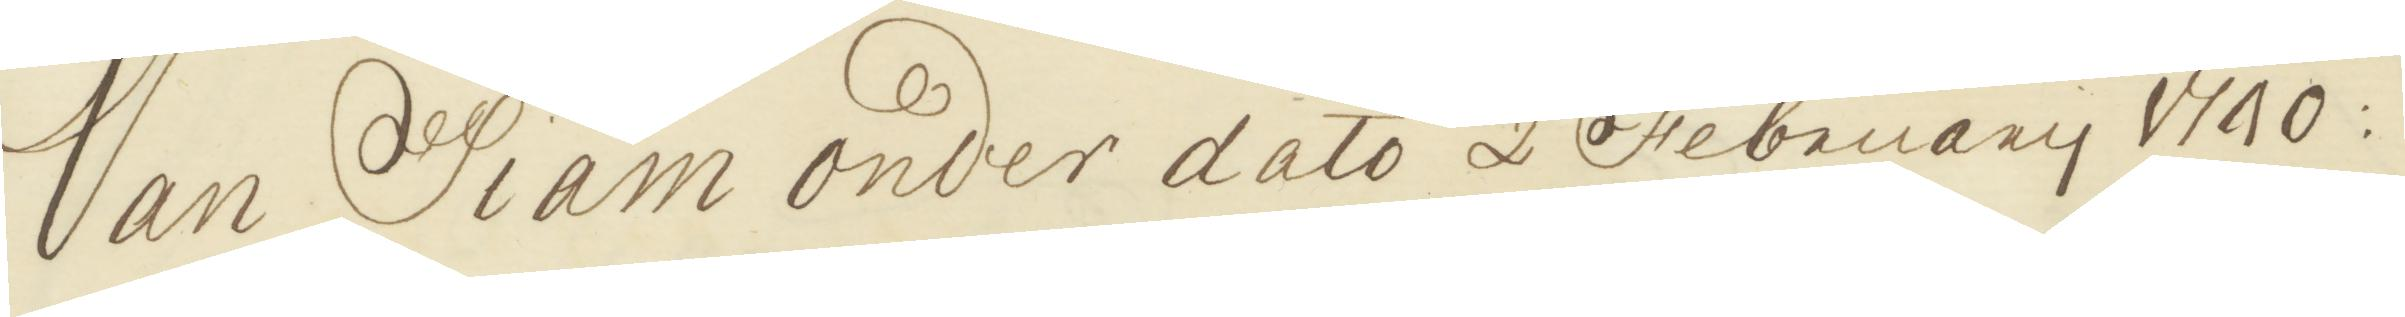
Van Siam onder dato 2 Februarij 1740:
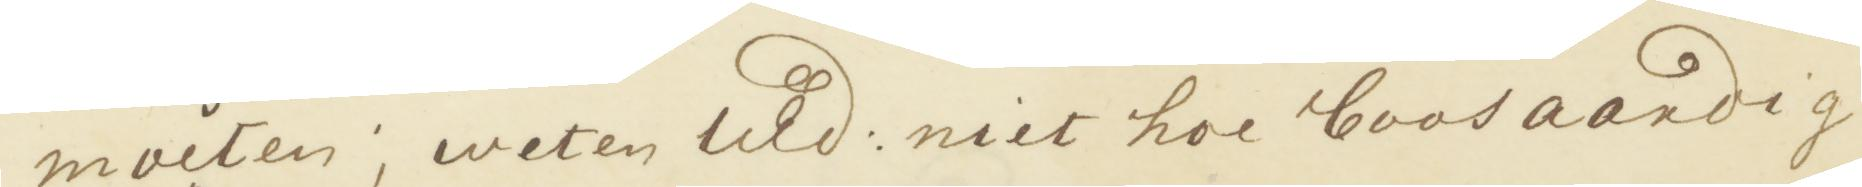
moesten; weten uEd: niet hoe boosaardig
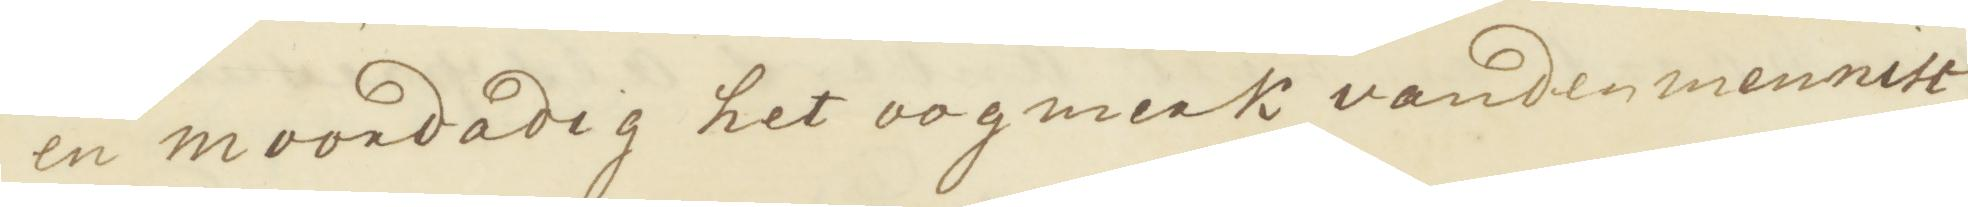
en moordadig het oogmerk vanden mennist
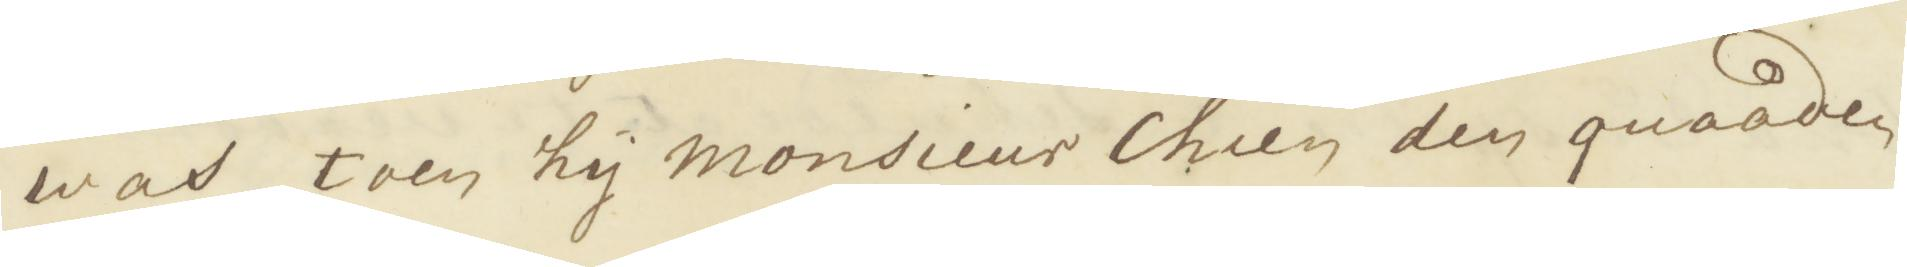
was, toen hij monsieur chien den quaaden
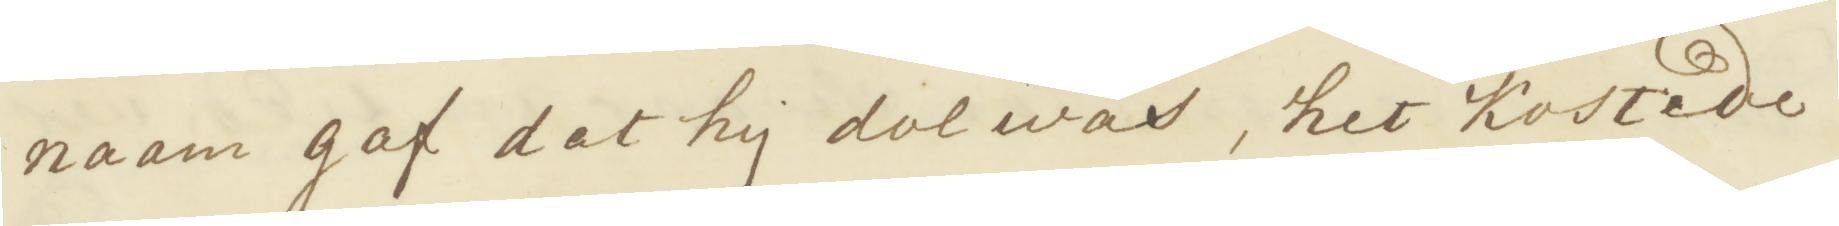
naam gaf dat hij dol was, het kostede
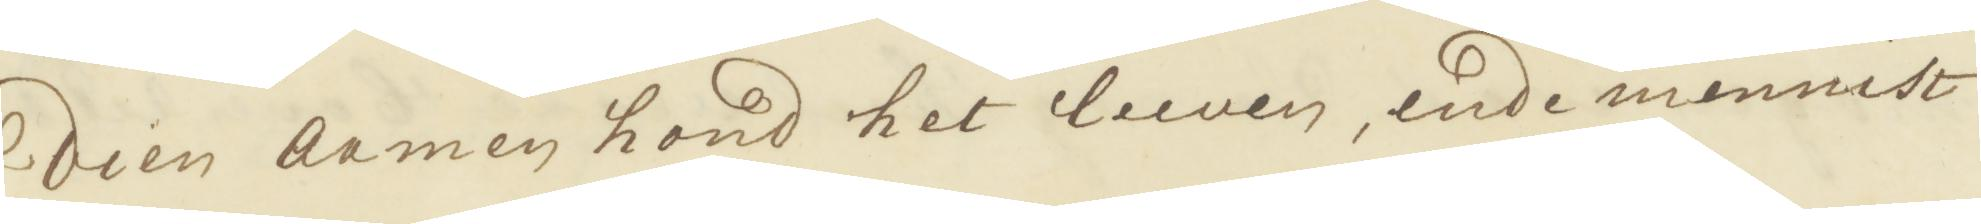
dien armen hond het leeven, ende mennist
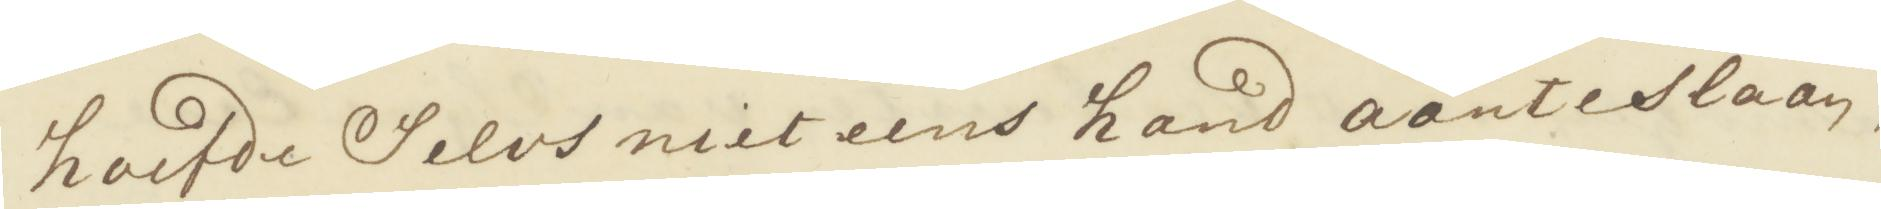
hoefde selvs niet eens hand aanteslaan,
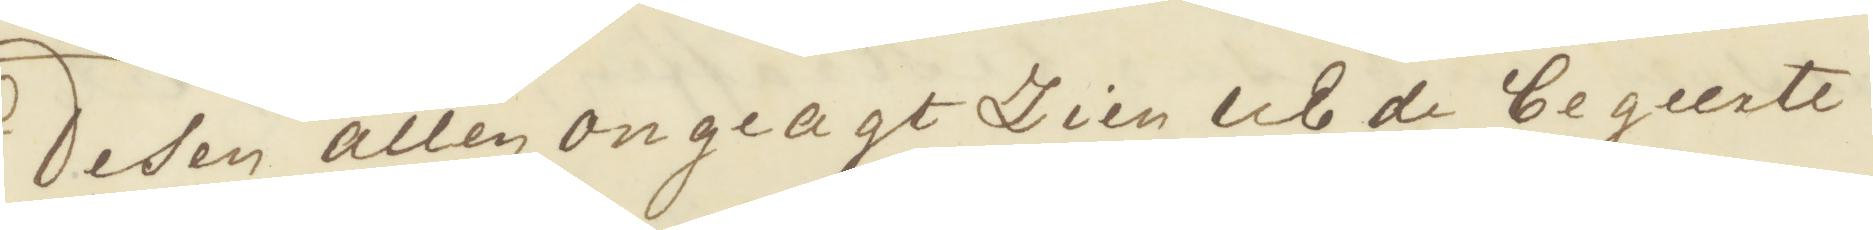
desen allen ongeagt zien uE de begeerte
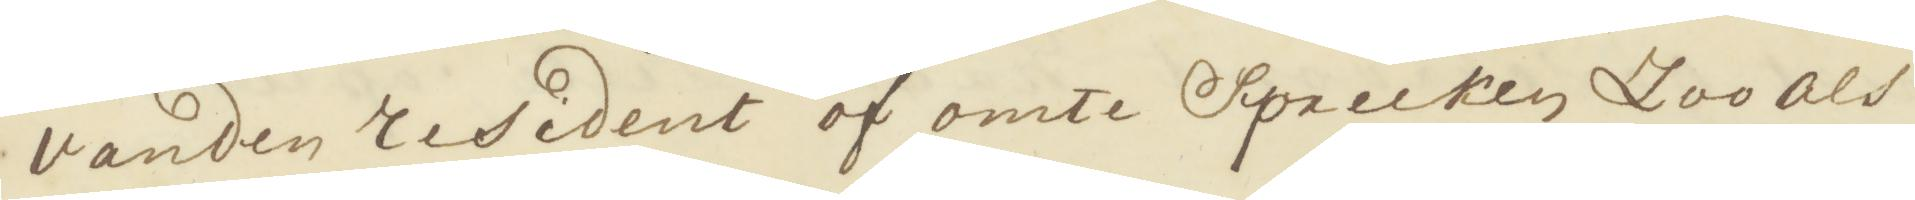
vanden resident of omte Spreeken zoo als
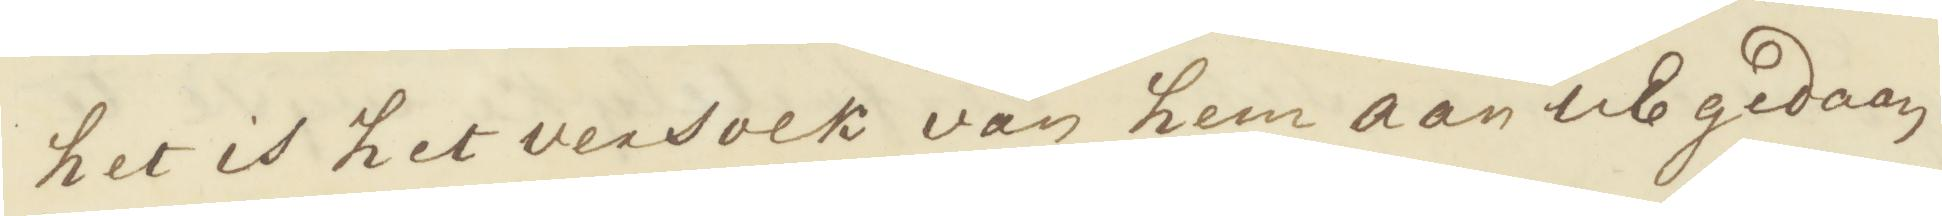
het is het versoek van hem aan uE gedaan
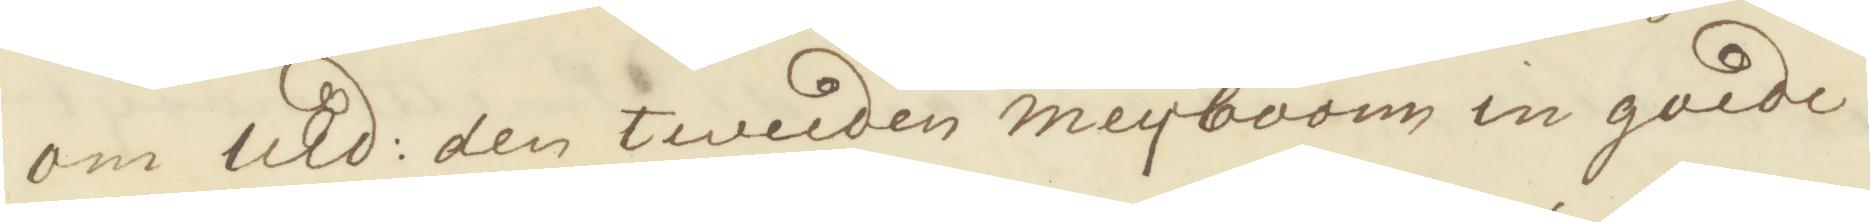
om uEd: den tweeden meijboom in goede
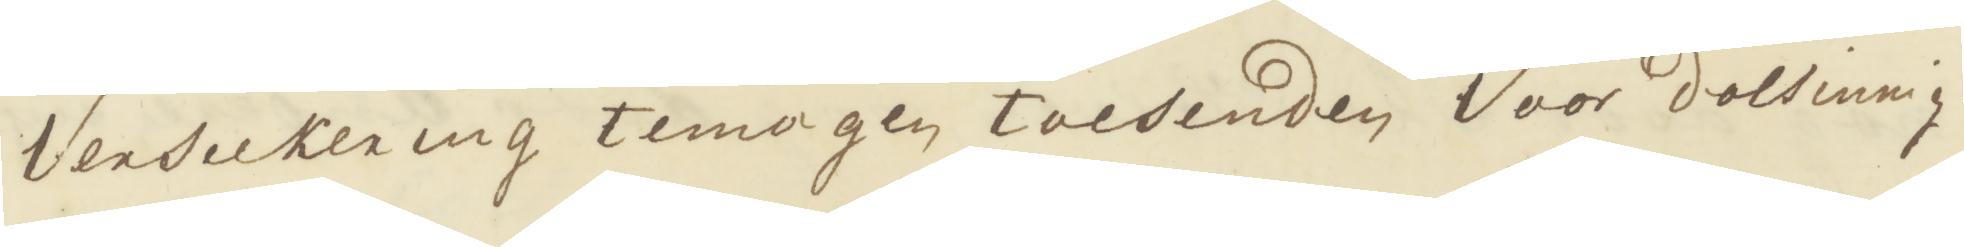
verseekering te mogen toesenden voor dolsinnig
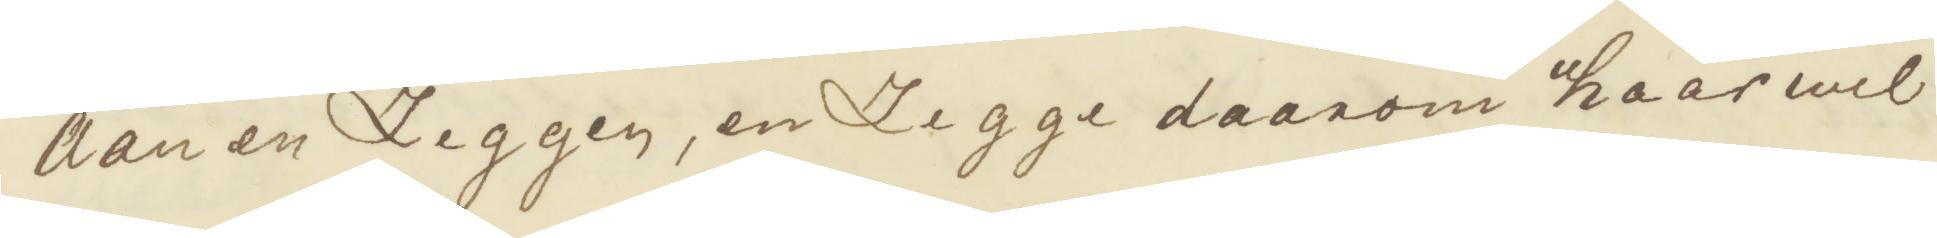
aan en zeggen, en zegge daarom haar wel
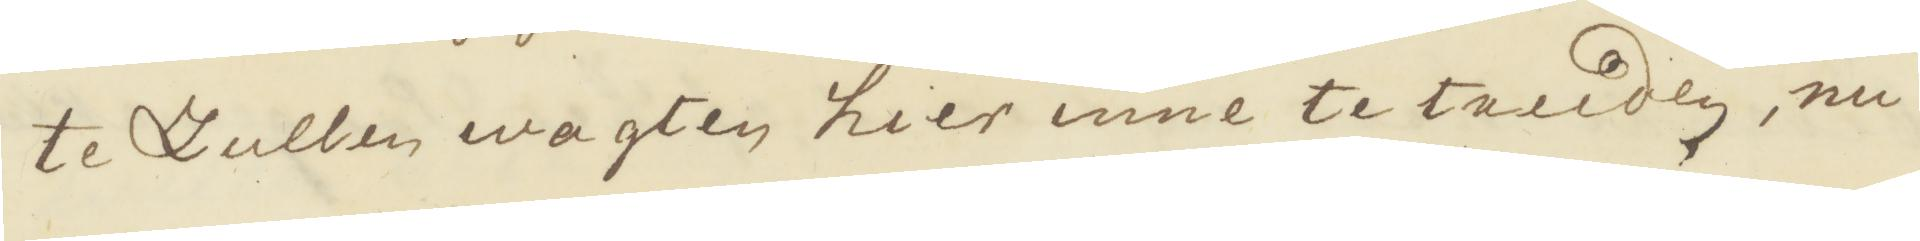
te zullen wagten hier inne te treeden, nu
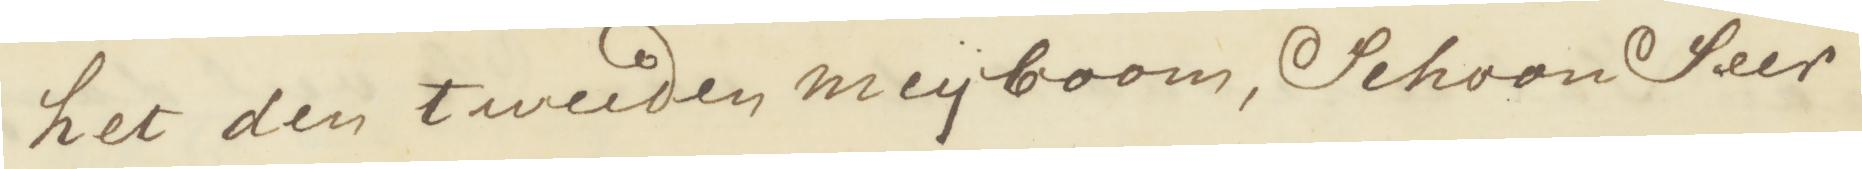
het den tweeden meijboom, Schoon Seer
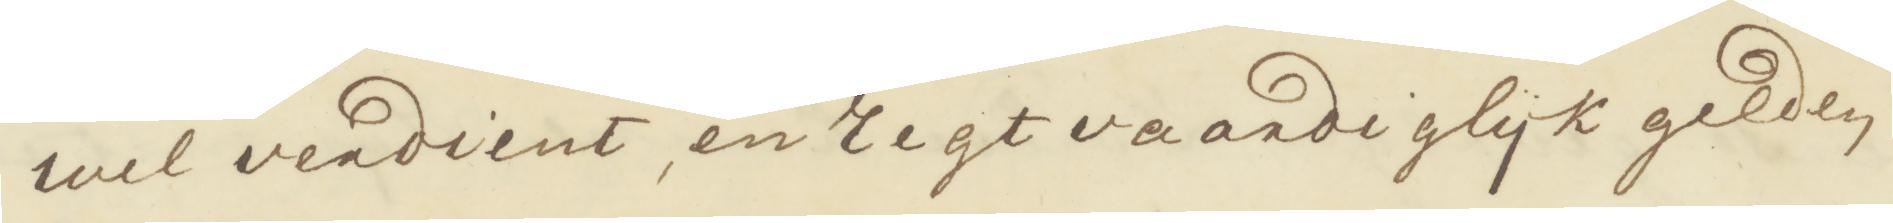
wel verdient, en regt vaardiglijk gelden
